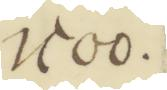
1500.
